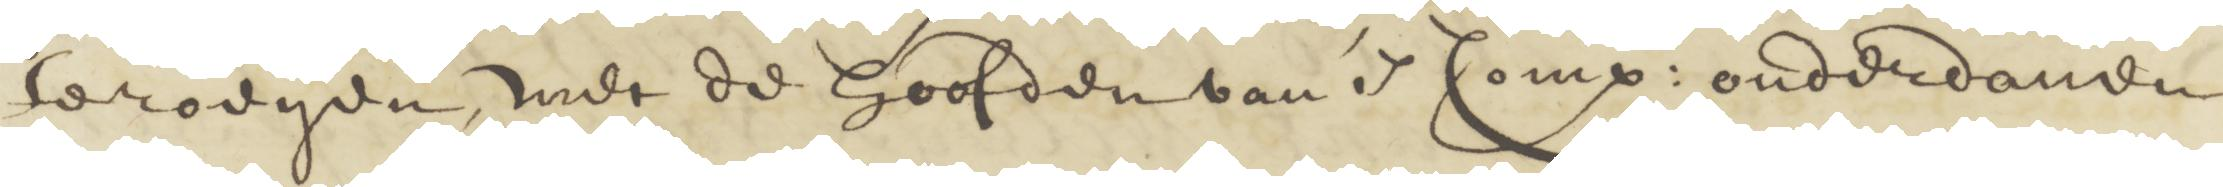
te roeijen, met de Hoofden van ’s Comp:s onderdanen
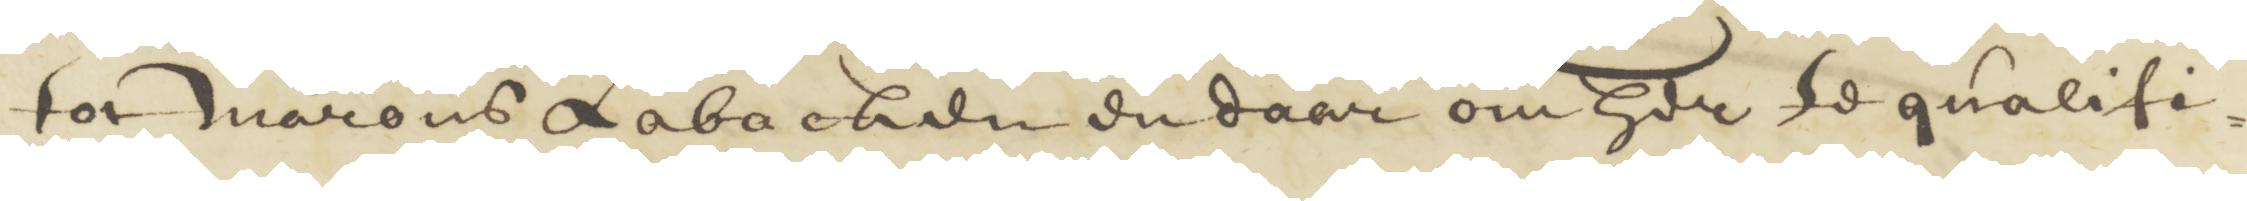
tot marous Labacken en daar om her te qualifi=
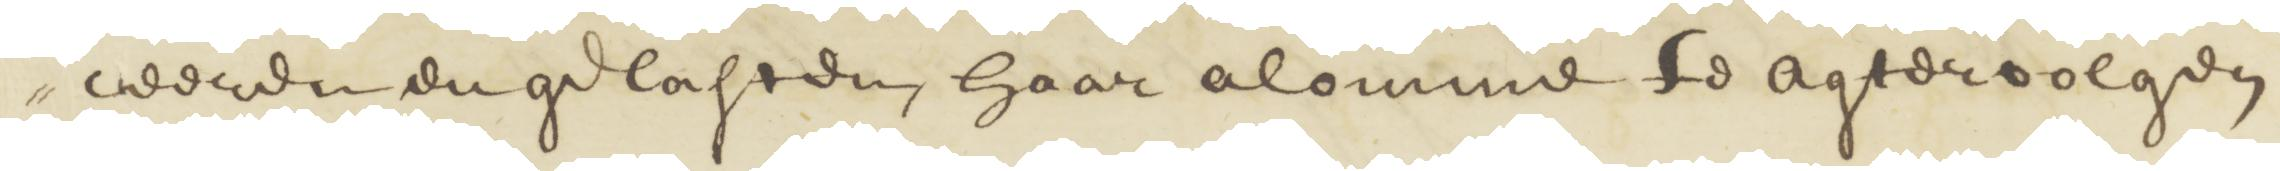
„ceeren en gelasten, haar alomme te agtervolgen
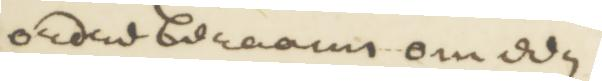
ordre beraamt om een
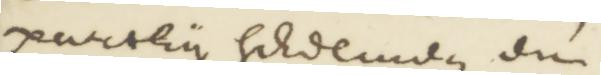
parthij schelmen en
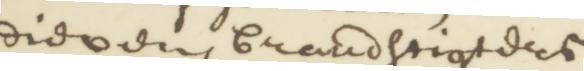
dieven, brandstigters
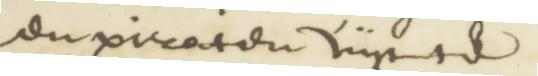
en piraten uijt te
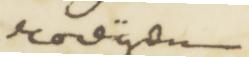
roeijen
